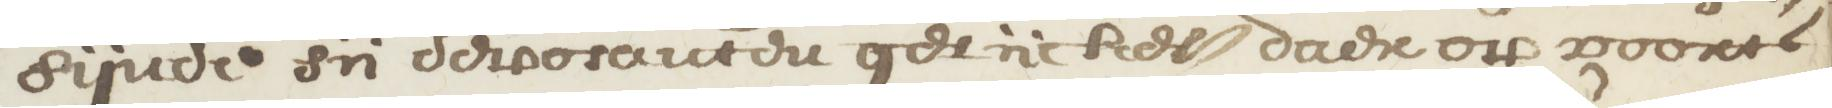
sijnde sij deposanten gelijckelijk daer op voorts
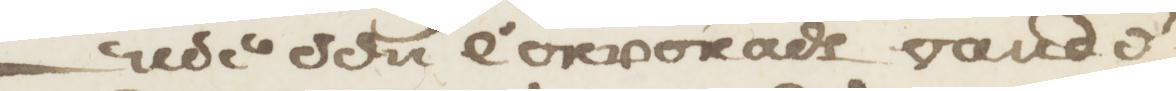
gegaen Ende een corporael vande
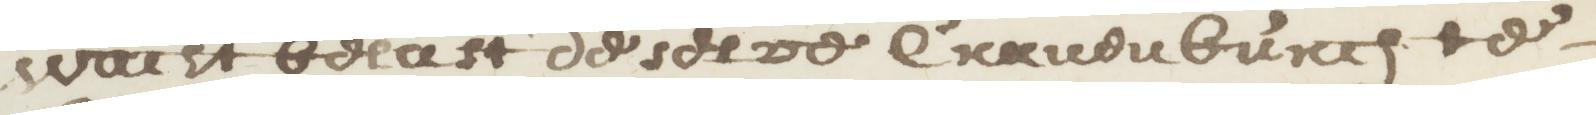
wacht belast de selve Cranenburch te
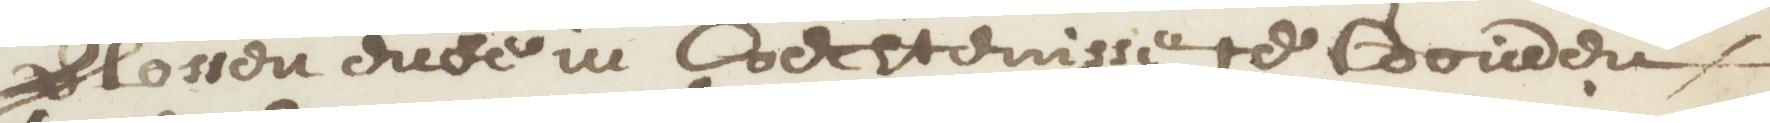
verlossen ende in hechtenisse te houden,
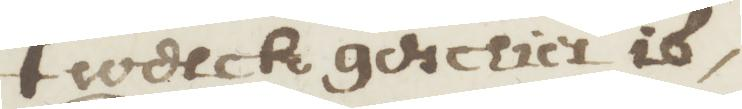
't welck geschiet is, Gedaen in
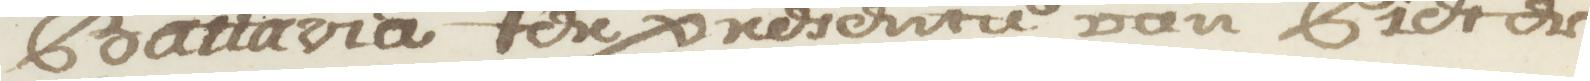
Battavia ter presentie van Pieter
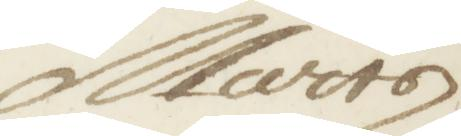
Marts
